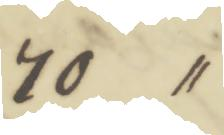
70 „
